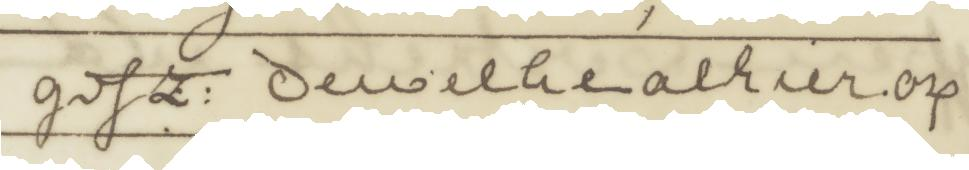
gesz: dewelke alhier op
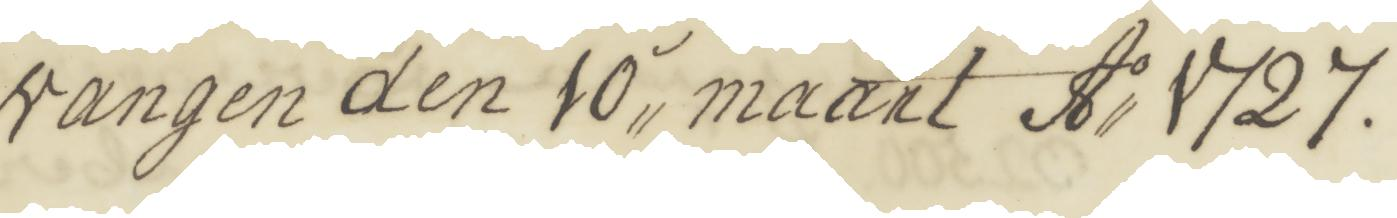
vangen den 10„' maart A„o 1727.
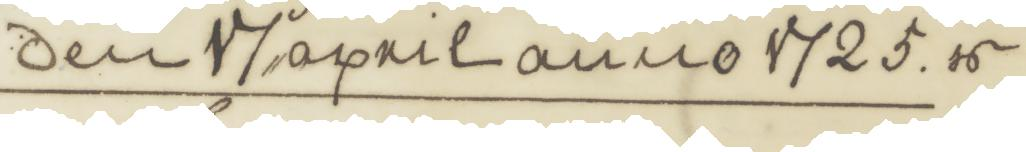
den 17„' april anno 1725. is
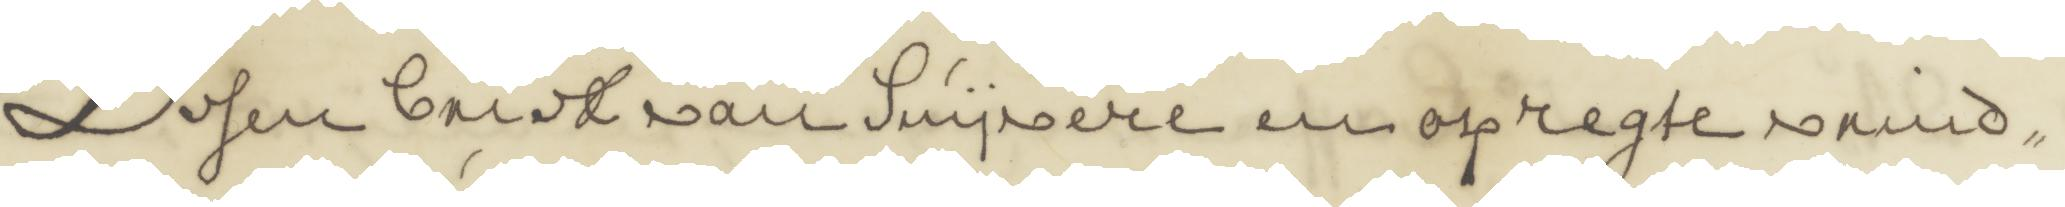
Desen brief van suijvere en opregte vrind„
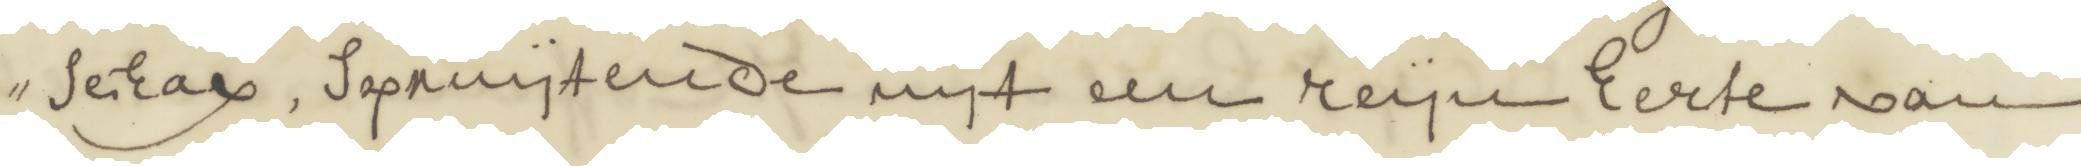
„schap, spruijtende uijt een reijn herte van
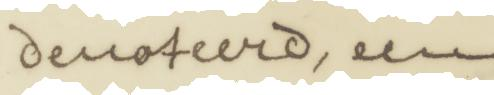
denoteerd, een
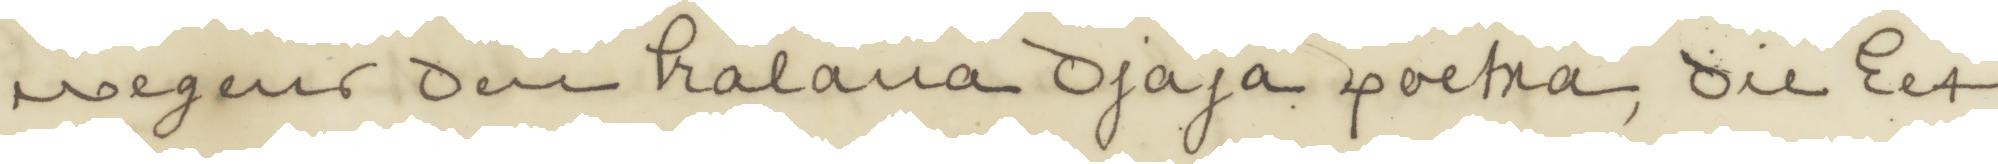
wegens den kalana djaja poetra, die het
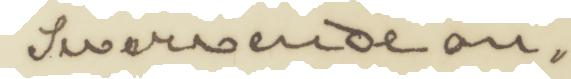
swervende on„
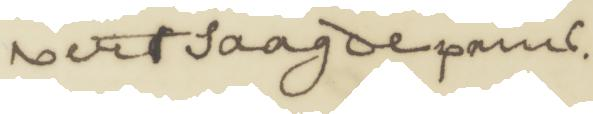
vertsaagde prins.
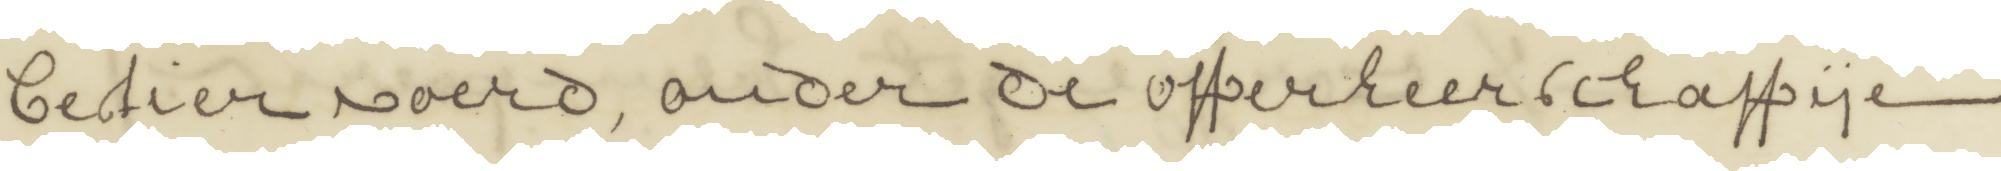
bestier voerd, onder de opperheerschappije
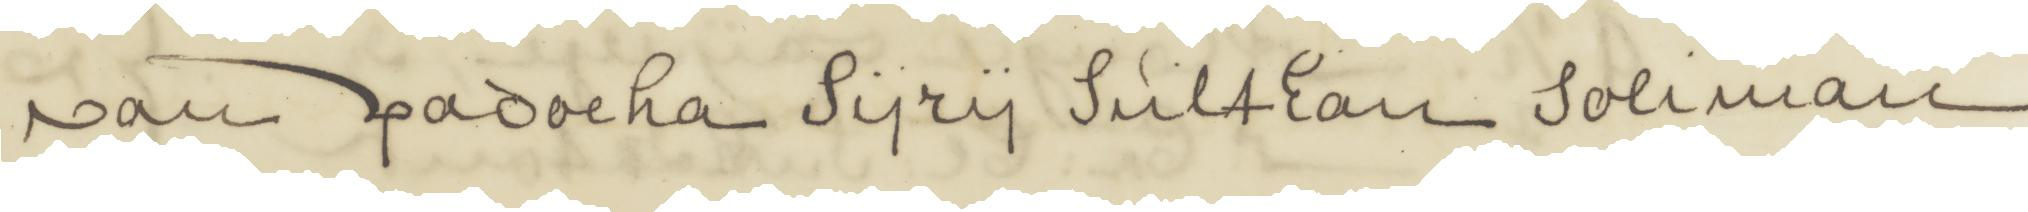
van padoeka sijrij sulthan soliman
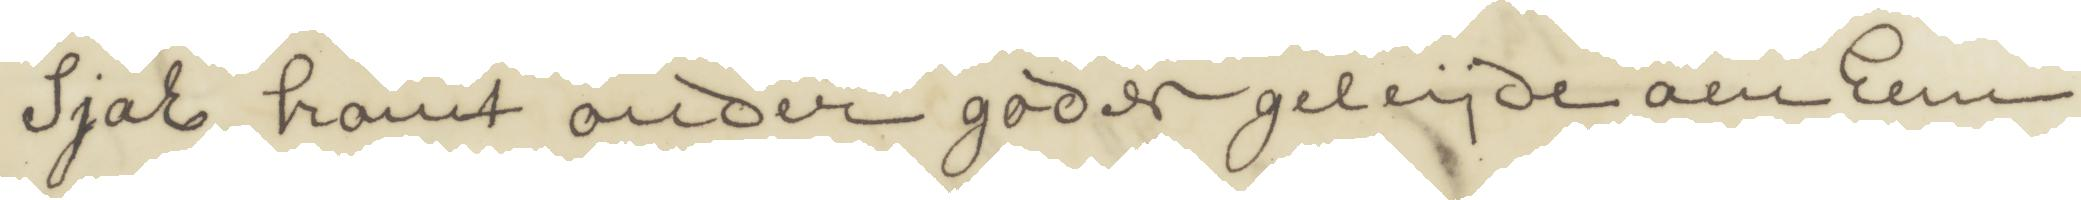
sjah, komt onder goder geleijde aen hem
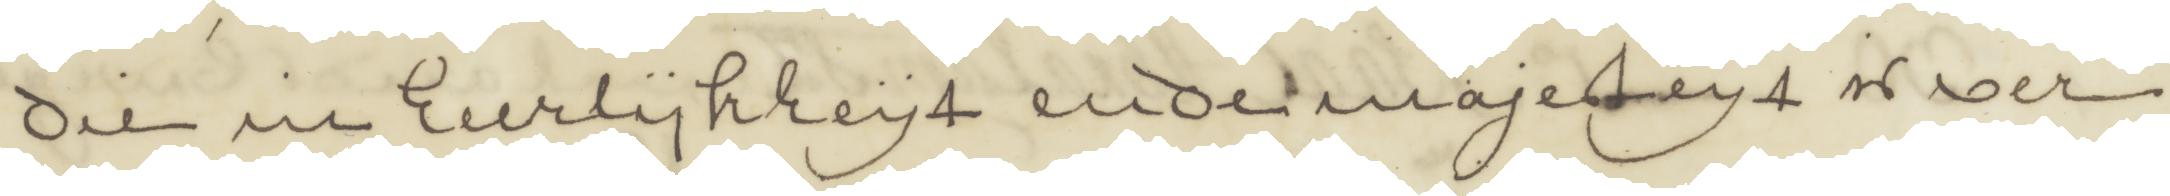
die in heerlijkheijt ende majesteijt is ver
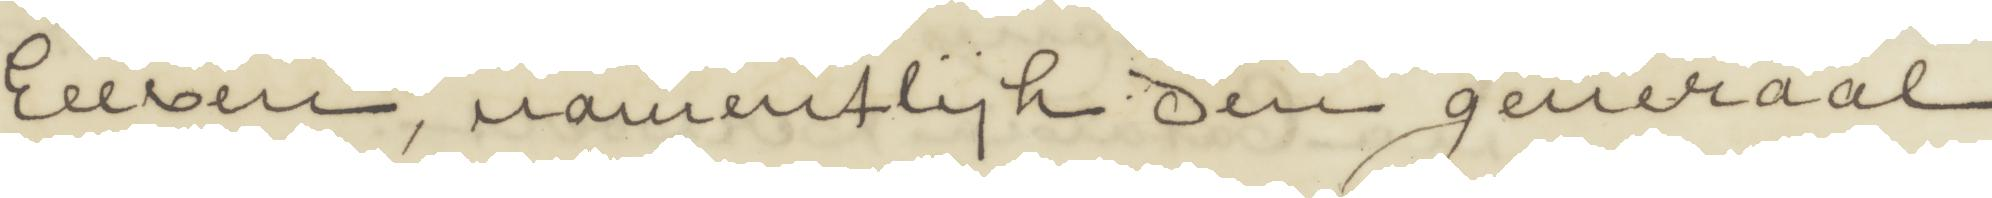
heeven, namentlijk den generaal
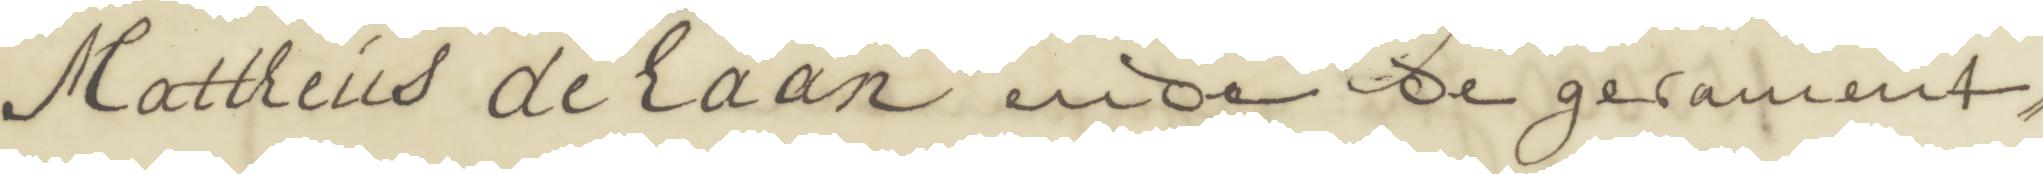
Mattheus de haan ende de gesament„
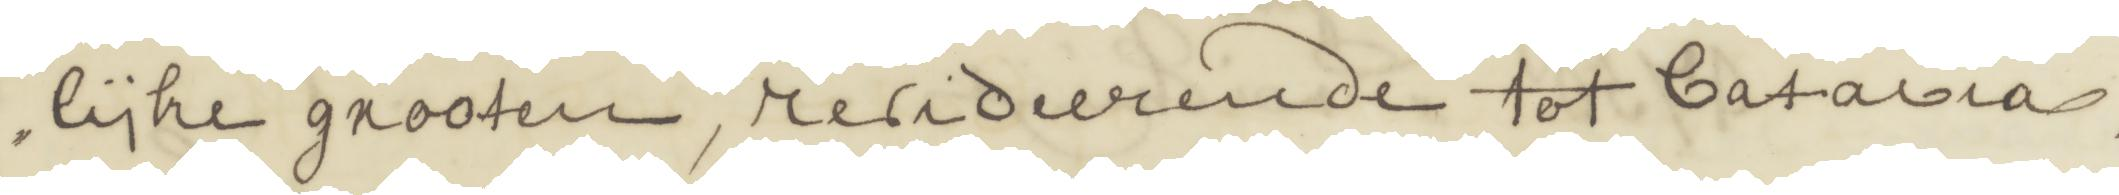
„lijke grooten, resideerende tot batavia,
